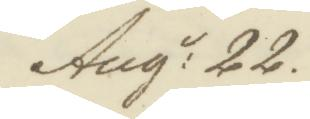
Aug:s 22.
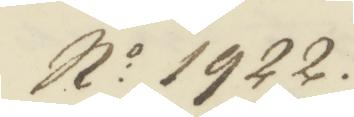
N:o 1922.
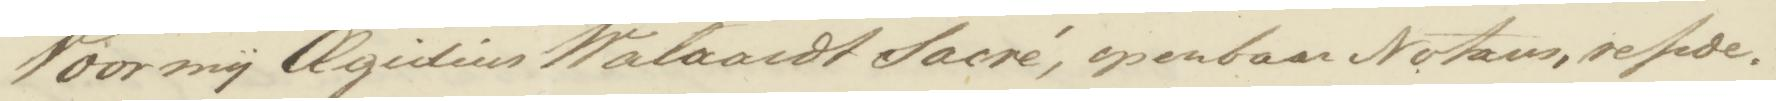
Voor mij AEgidius Walaardt Sacré, openbaar Notaris, reside,
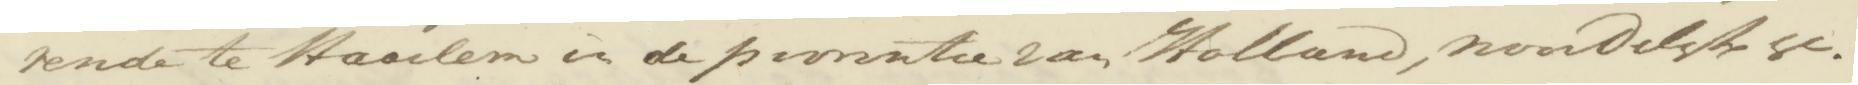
rende te Haarlem in de provintie van Holland, noordeljk ge,
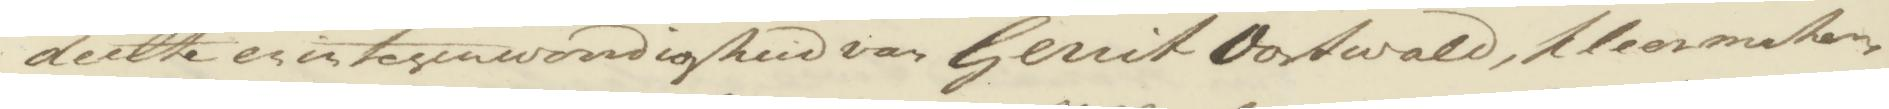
deelte en in tegenwoordigheid van Gerrit Oostwald, kleermaker
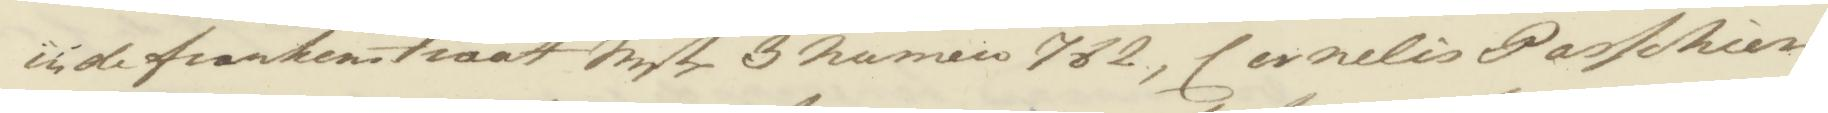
in de frankenstraat wyk 3 numero 762, Cornelis Passchier,
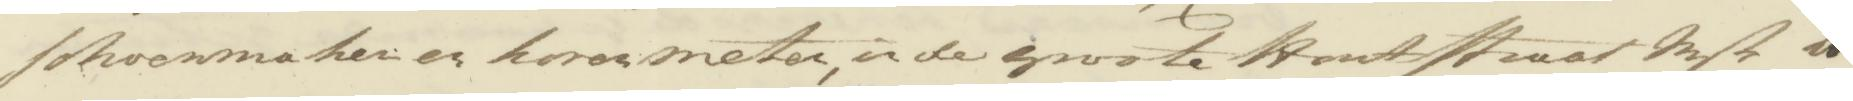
schoenmaker en korenmeter, in de groote Houtstraat wyk 4
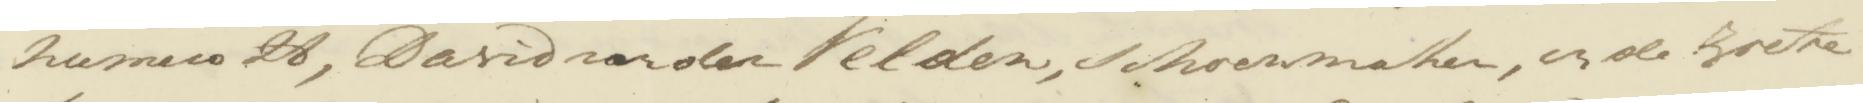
numero 26, David van der Velden, schoenmaker, in de Zoete
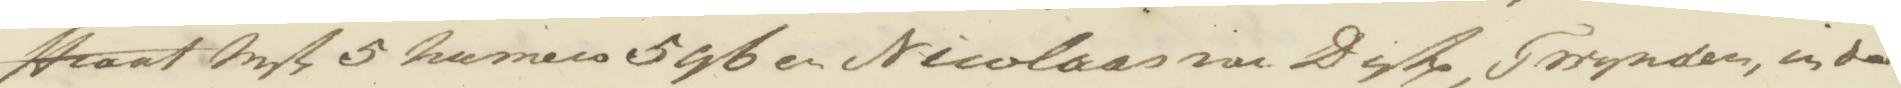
straat wyk 5 numero 596 en Nicolaas van Dyk, Twynder, in de
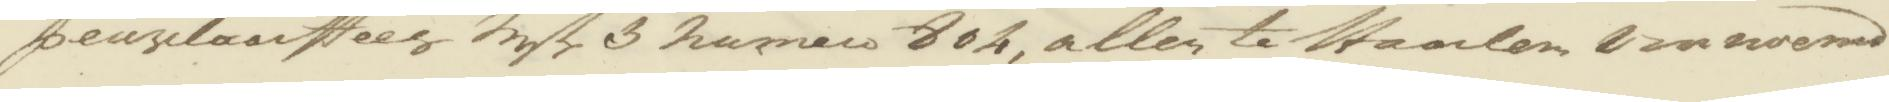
peuzelaarsteeg wyk 3 numero 804, allen te Haarlem voornoemd
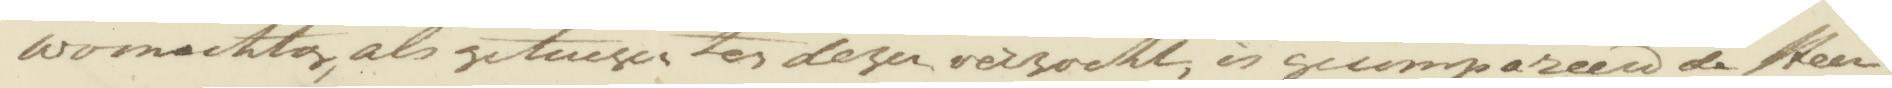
woonachtig, als getuigen ter dezen verzocht, is gecompareerd de Heer
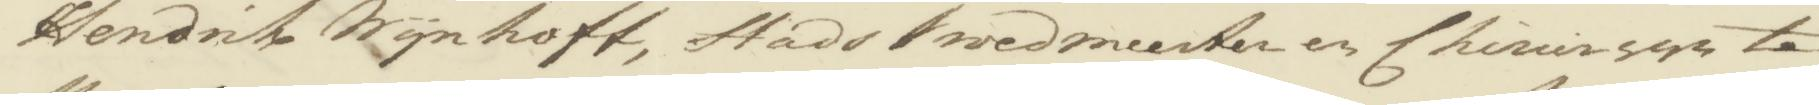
Hendik Wijnhoff, stads swedmeester en Chirurgyn te
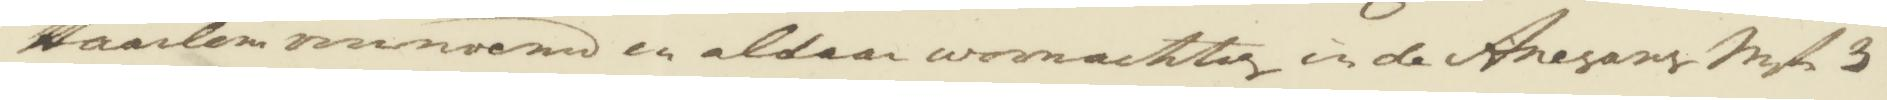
Haarlem vernoemd en aldaar woonachtig in de Anegang wyk 3
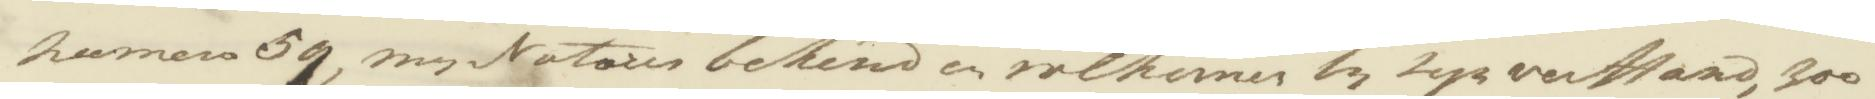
numero 59, my Notaris bekend en volkomen by zyn verstand, zoo
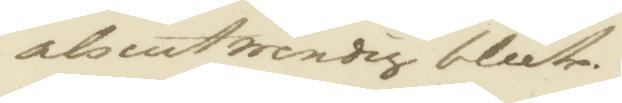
als uitwendig bleek.
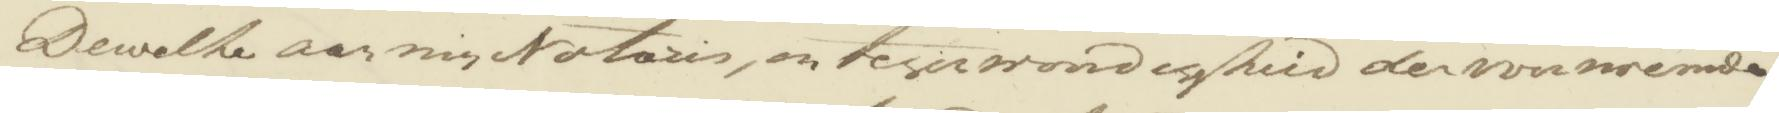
Dewelke aan my Notaris, in tegenwoordigheid der voornoemde
